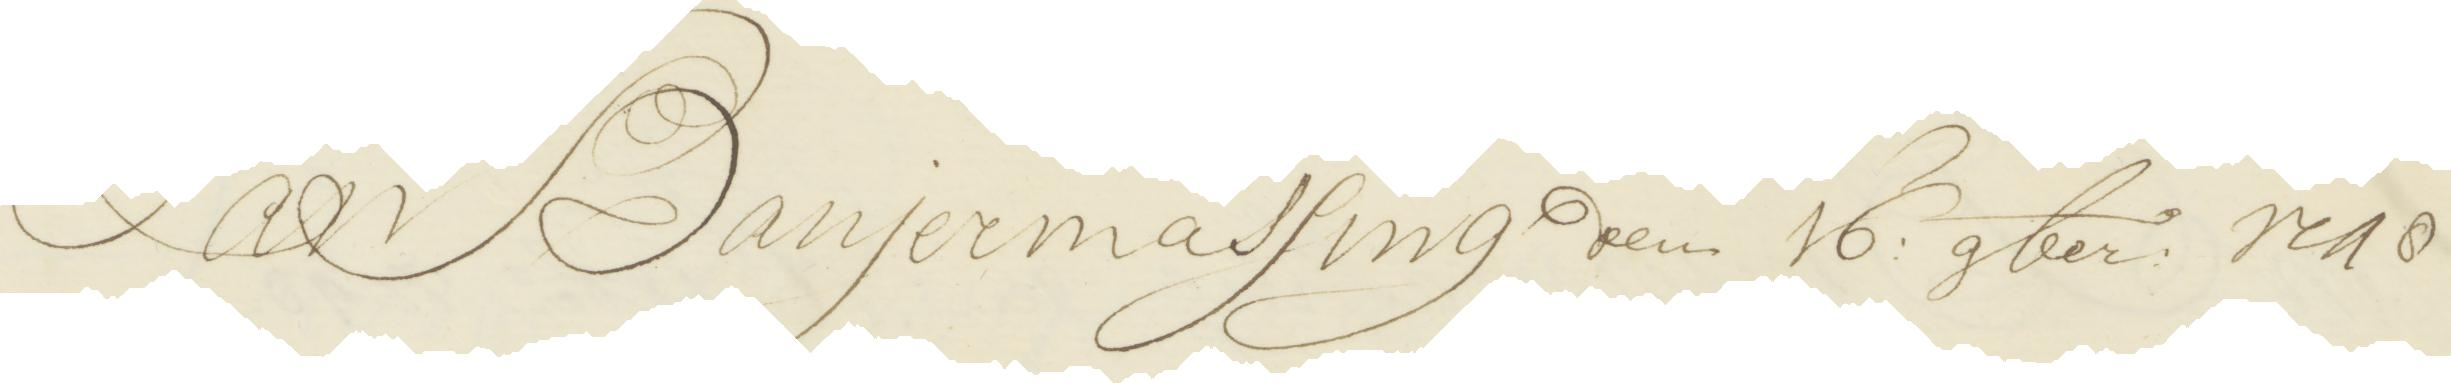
Van Banjermassing den 16:' 9ber: 1748
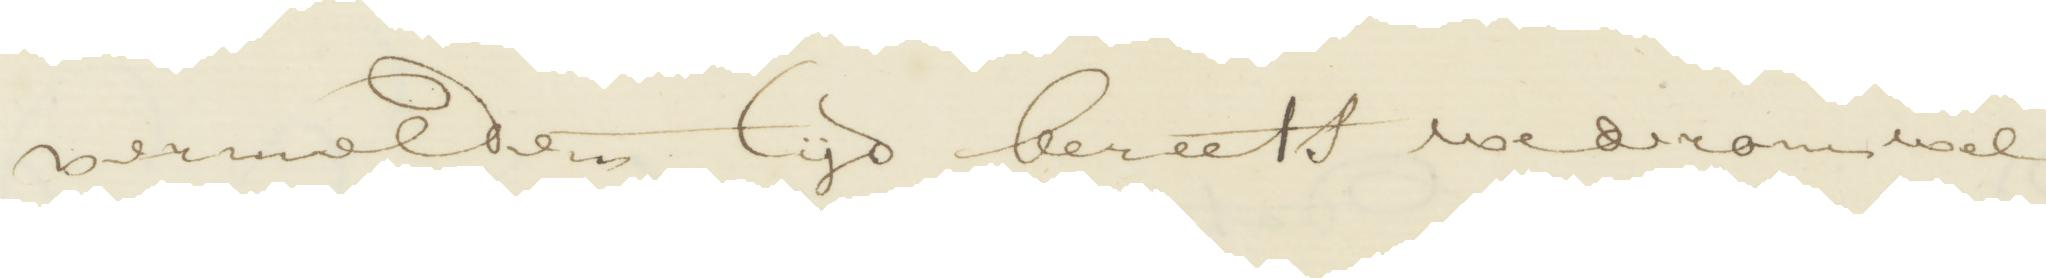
vermelden tijd bereets wederom wel
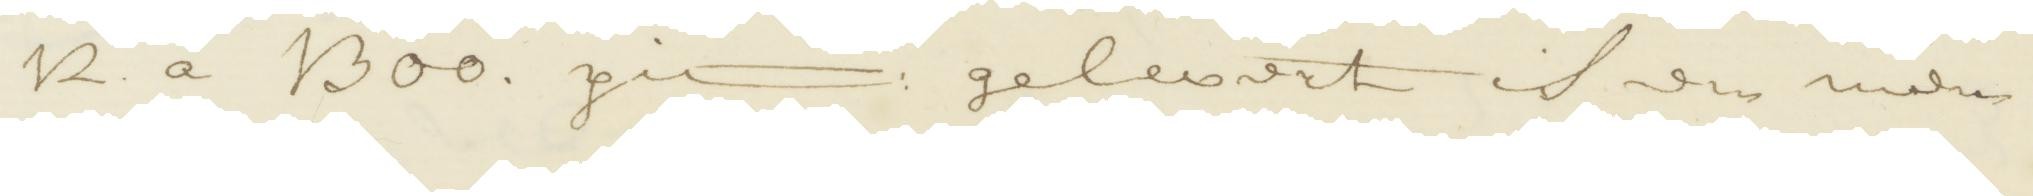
12. â 1300. pic:s gelevert is, en men
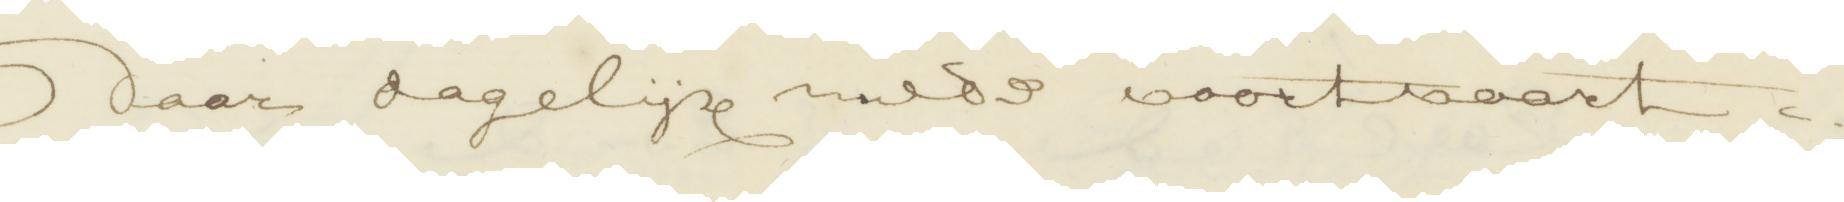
daar dagelijx mede voortvaart —
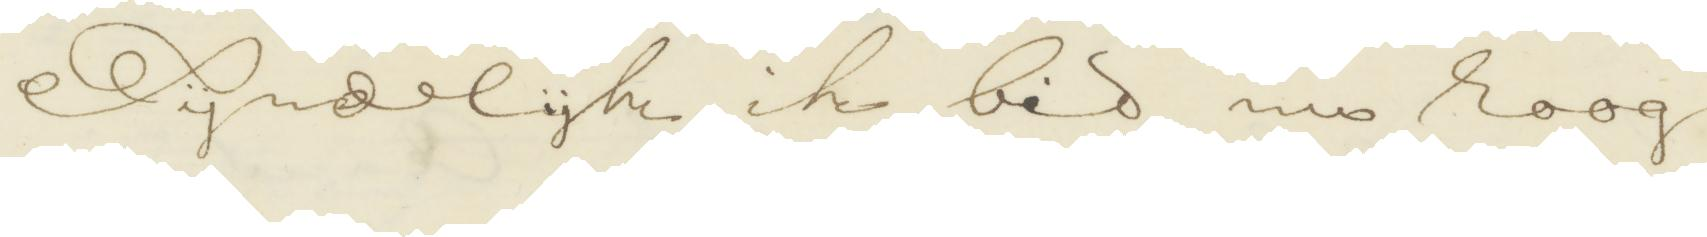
Eijndelijk ik bid uw hoog
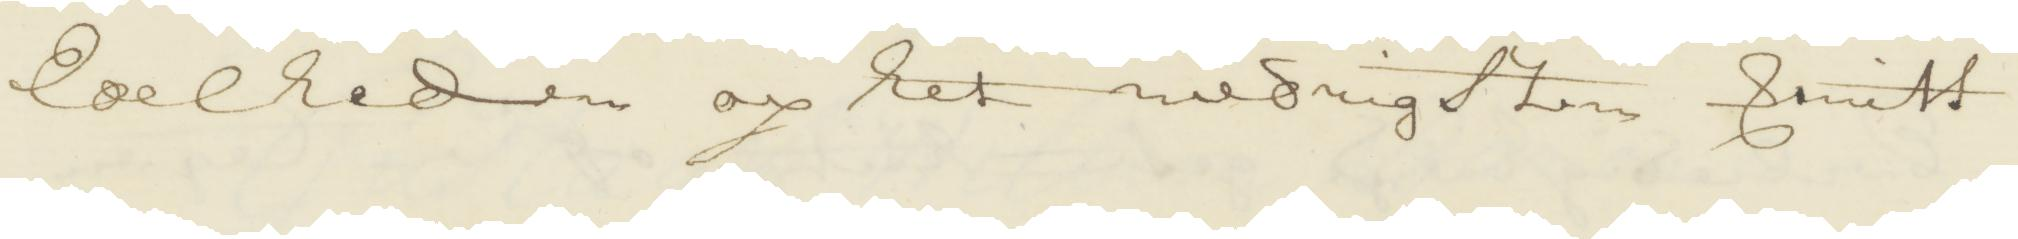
Edelheden op het nedrigsten vermits
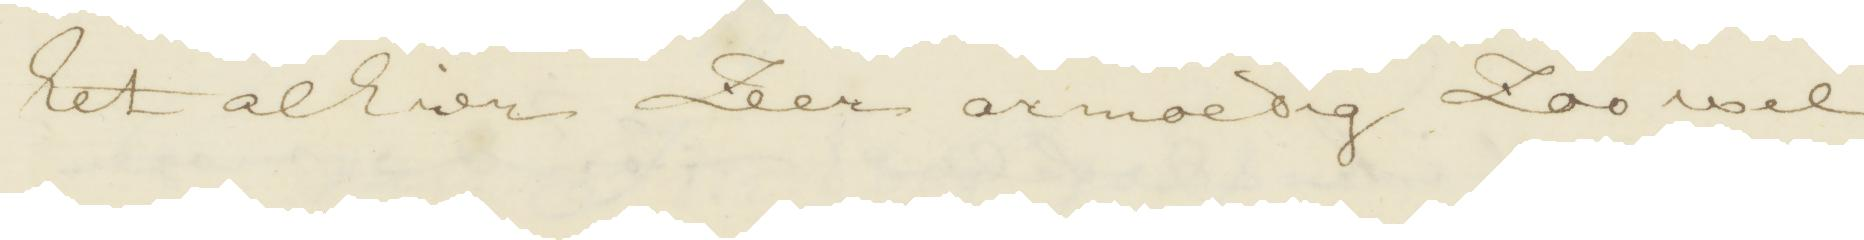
het alhier zeer armoedig zoo wel
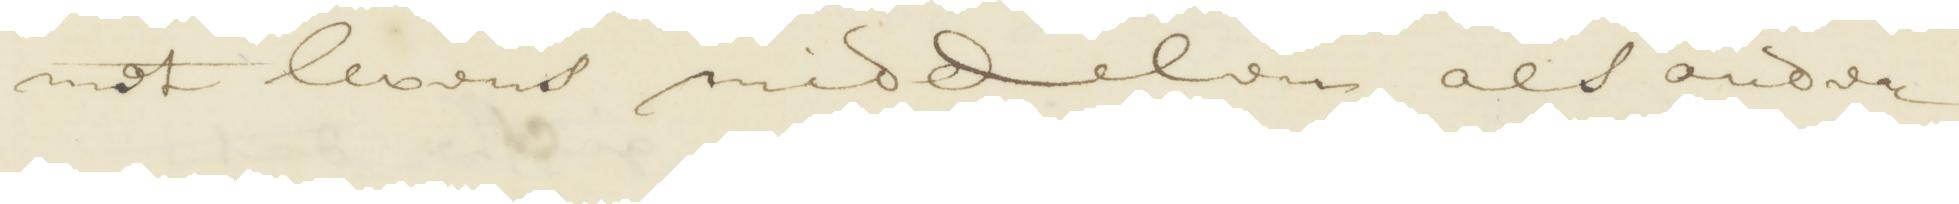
met levens middelen, als ander
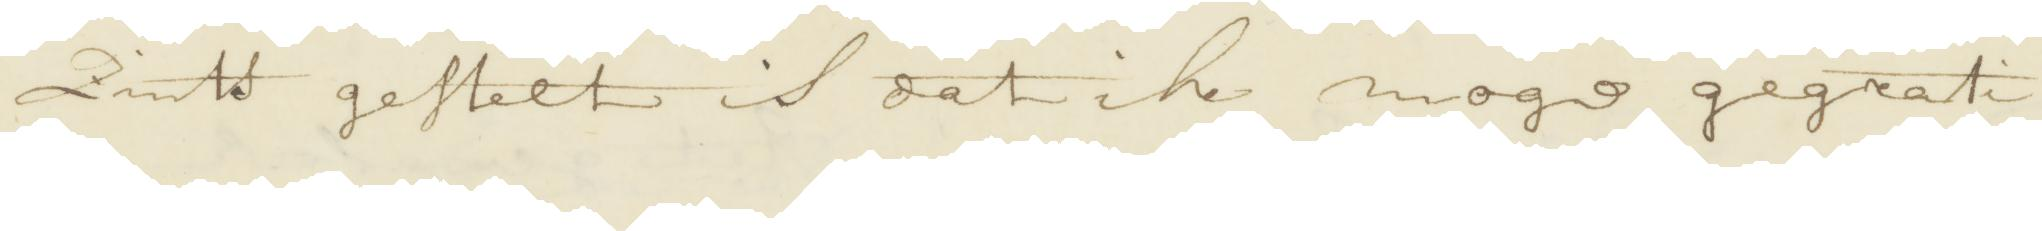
zints gestelt is dat ik moge gegrati
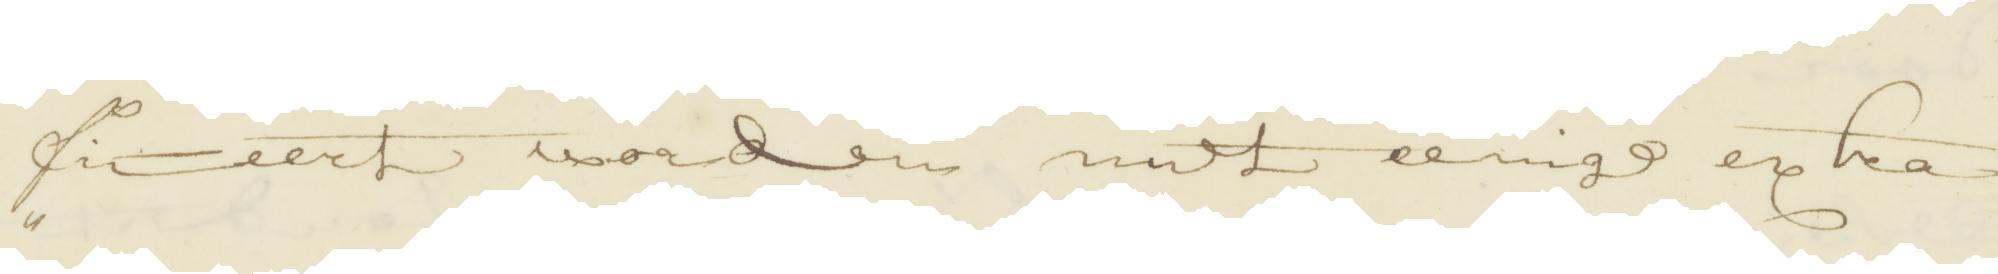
„ficeert worden met eenige extra
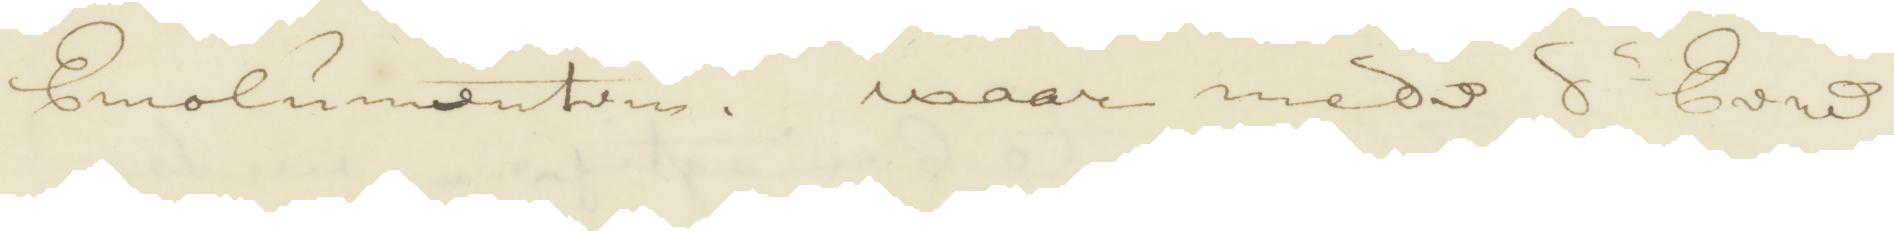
Emolumenten. waar mede d' Eere
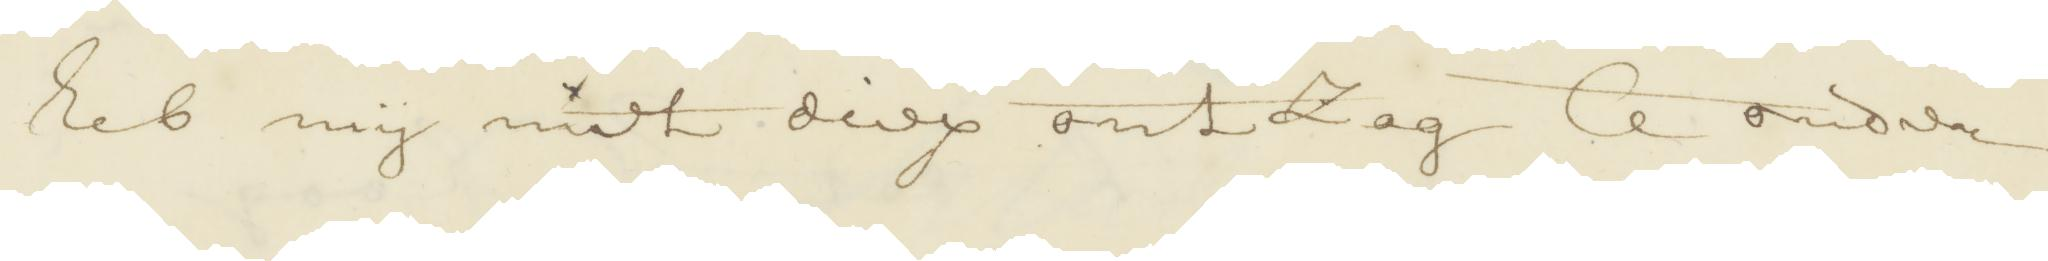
heb mij met diep ontzag te onder
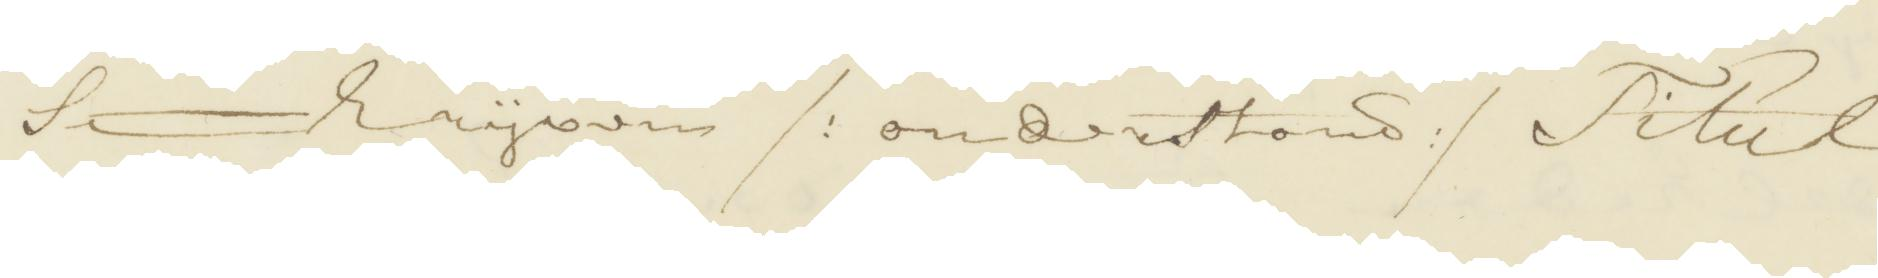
schrijven /: onderstond :/ Titul
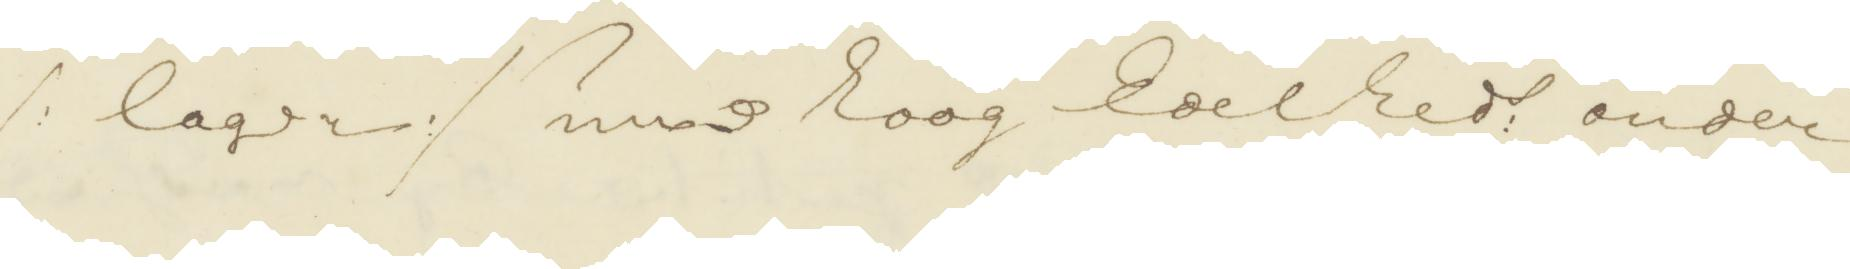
/: lager :/ uwe hoog Edelhed:s onder
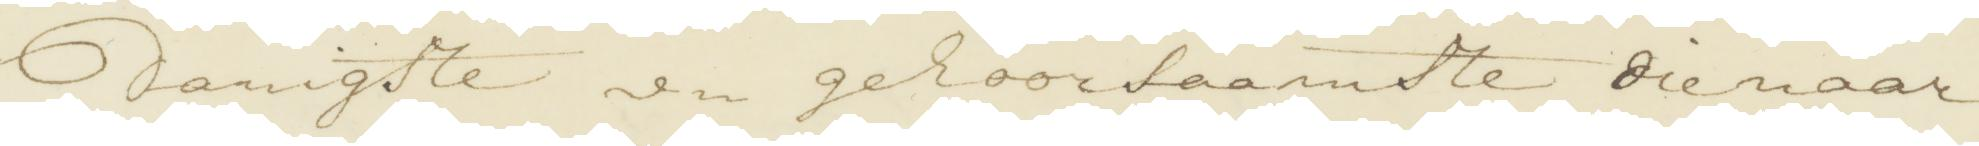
danigste en gehoorsaamste dienaar
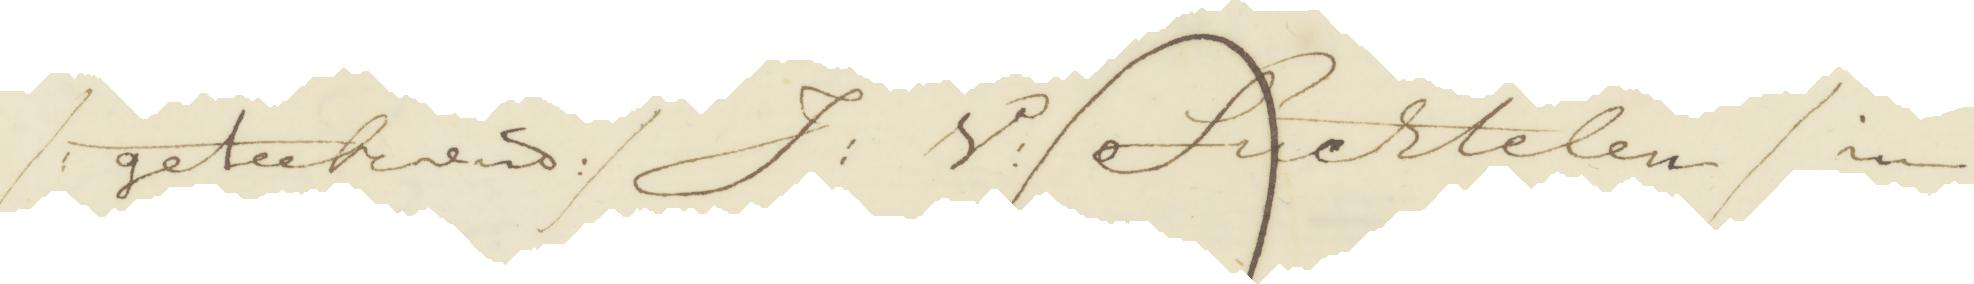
/: geteekend :/ J: V: Suchtelen / in
